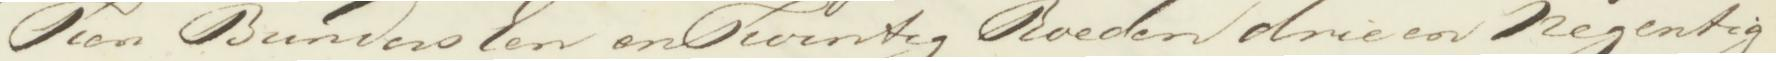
Tien Bunders Een en Twintig Roeden drie en Negentig
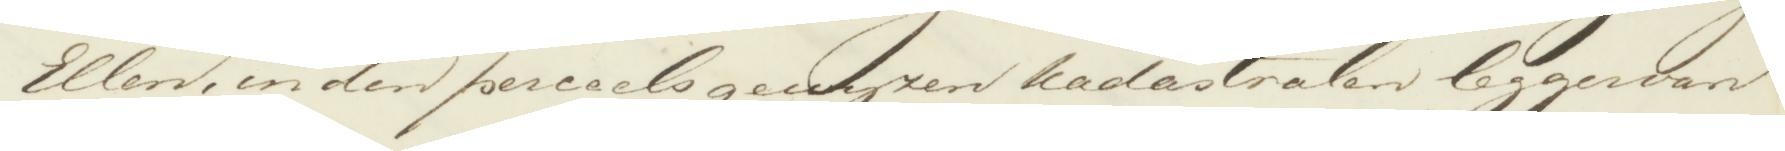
Ellen, in den perceels gewyzen kadastralen leggervan
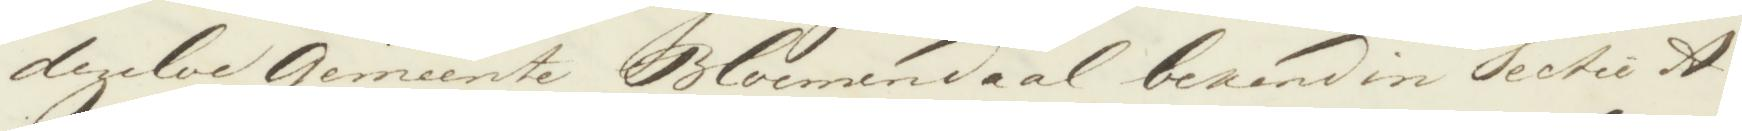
dezelve Gemeente Bloemendaal bekend in sectie A
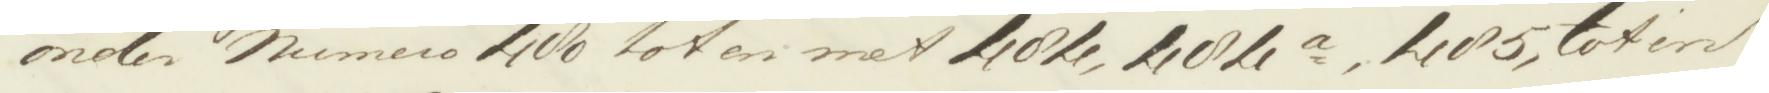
onder Numero 480 tot en met 484, 484=a, 485, tot en
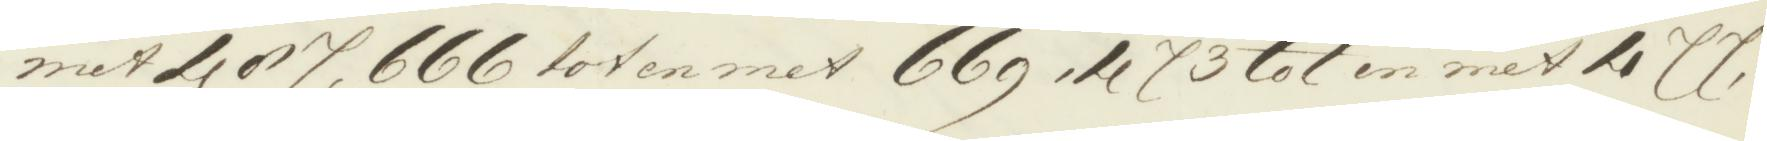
met 487, 666 tot en met 669 ,473 tot en met 477,
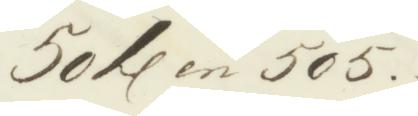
504 en 505.
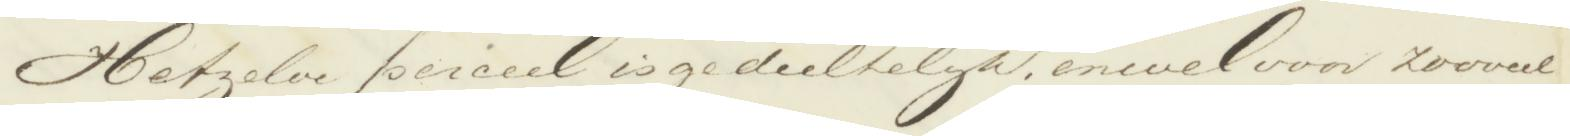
Hetzelve perceel is gedeeltelyk, enwel voor zooveel
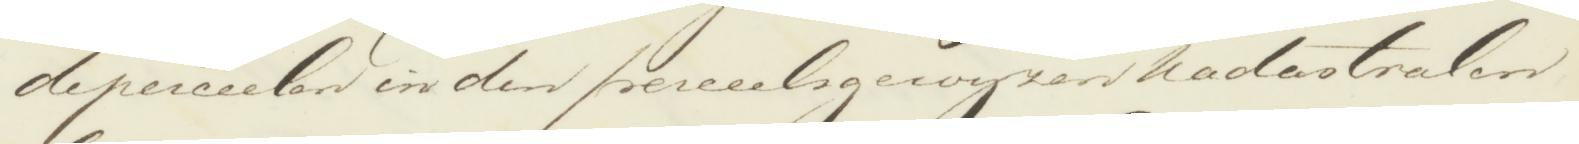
deperceelen in den perceelsgewyzen kadastralen
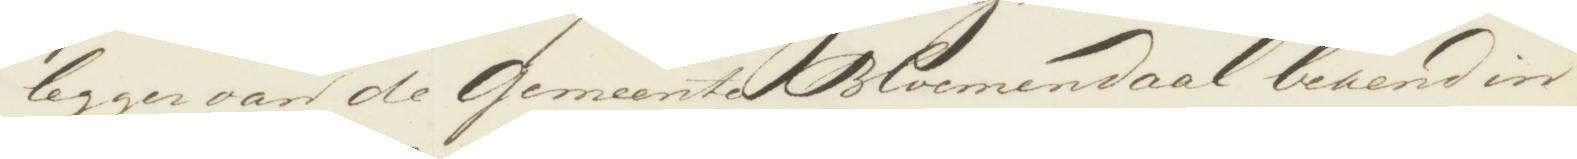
legger van de Gemeente Bloemendaal bekend in
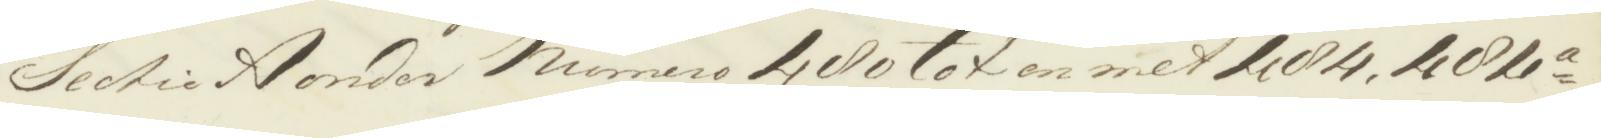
Sectie A onder Numero 480 tot en met 484, 484=a
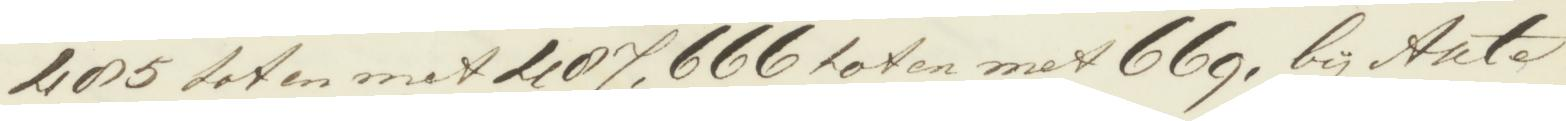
485 tot en met 487, 666 tot en met 669, bij Akte
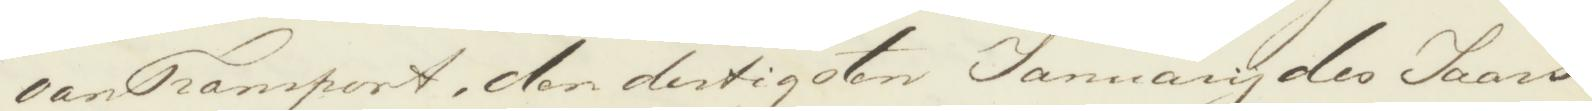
van Transport, den dertigsten Ianuarij des Iaars
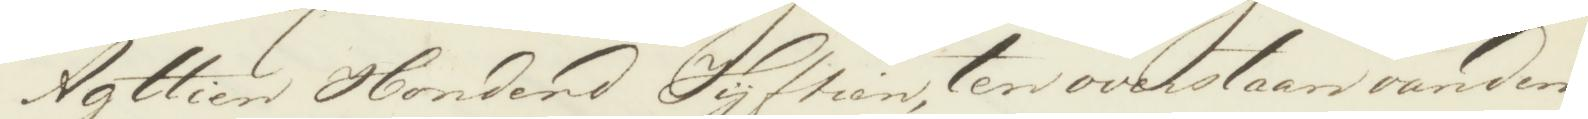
Agttien Honderd Vijftien, ten overstaan vanden
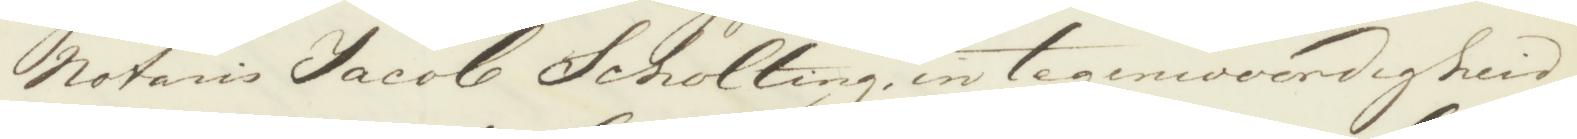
Notaris Iacob Scholting, in tegenwoordigheid
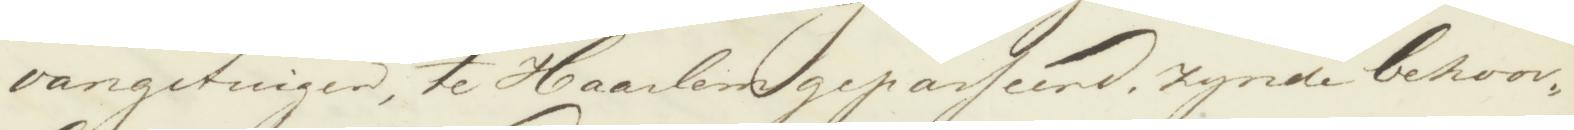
vangetuigen, te Haarlem gepasseerd, zynde behoor„
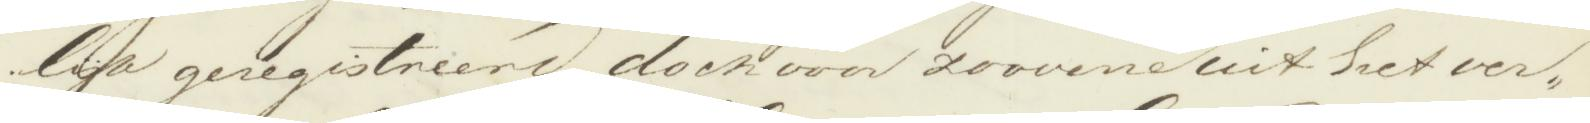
„lijk geregistreerd, doch voor zooverre uit het ver„
